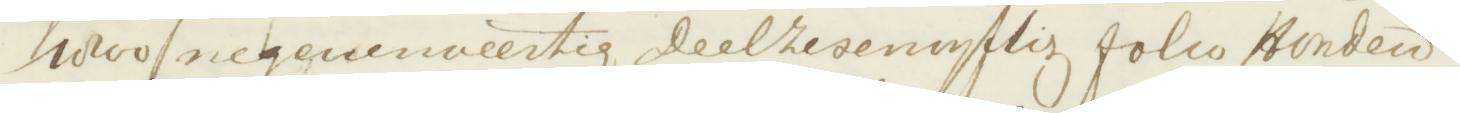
1800 negenenveertig Deel zesenvyftig folio Honderd
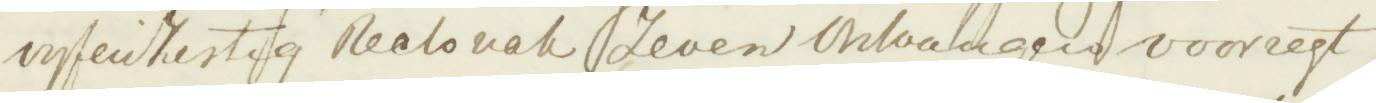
vyf en Zestig Recto vak Zeven ontvangen voorregt
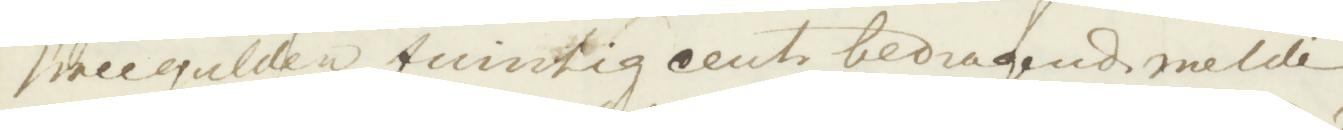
twee gulden twintig cents bedragende met de
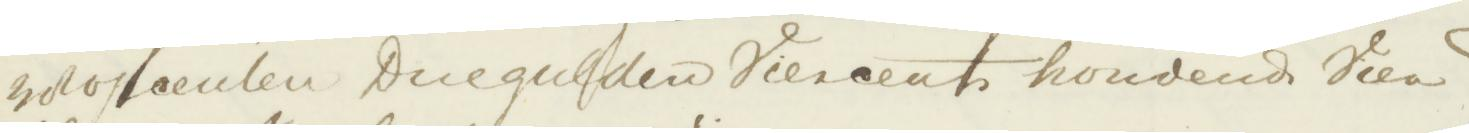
38 opcenten Drie gulden Vier cents honderd Vier
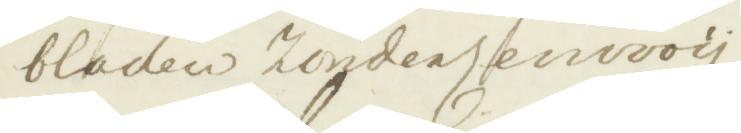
bladen zonder renvooij
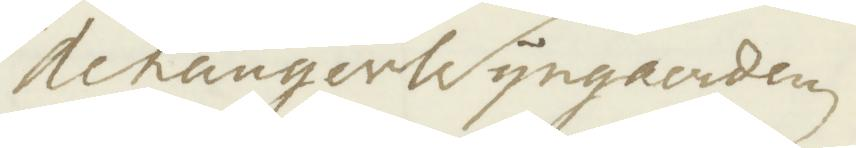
de Langer Wijngaerden
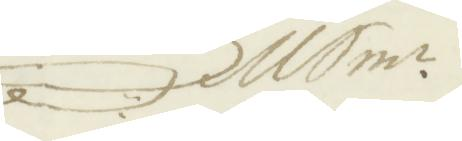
MO m.r
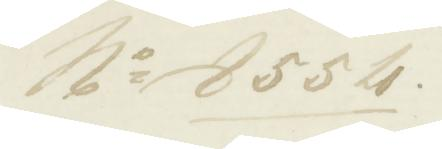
N=o 8554.
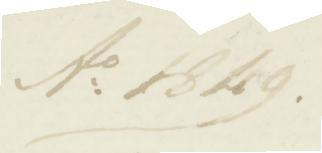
A=o 1849.
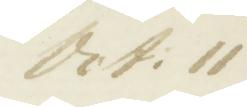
Oct: 11
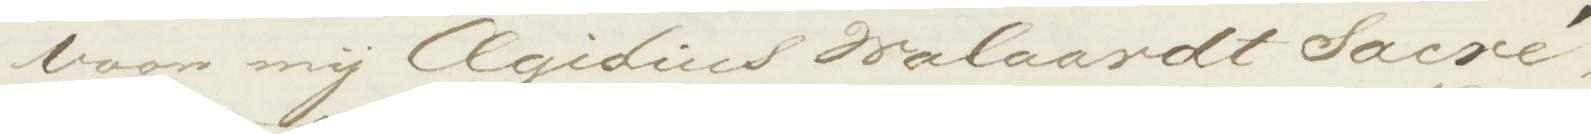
voor mij AEgidius Walaardt Sacré
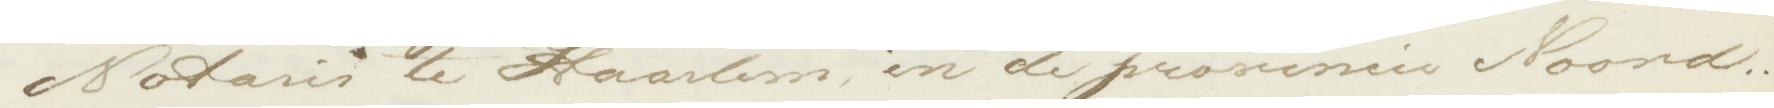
Notaris te Haarlem, in de provincie Noord,
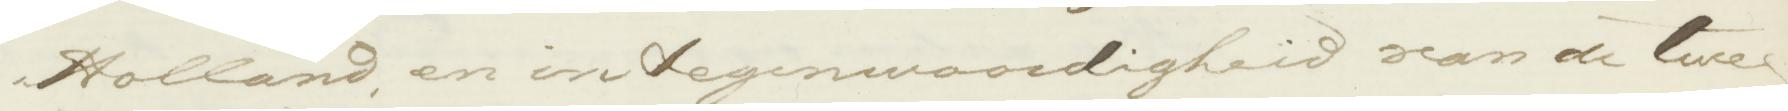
„Holland, en in tegenwoordigheid van de twee
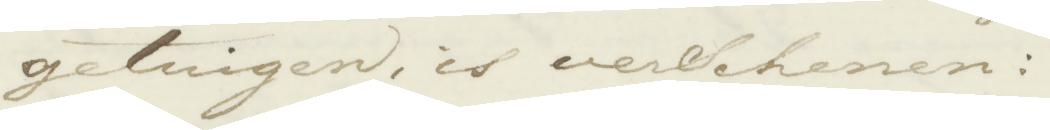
getuigen, is verschenen:
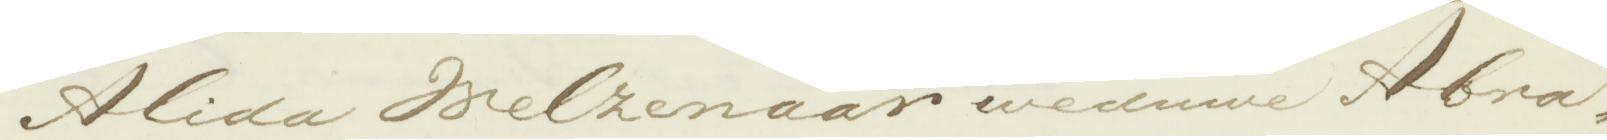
Alida Welzenaar weduwe Abra
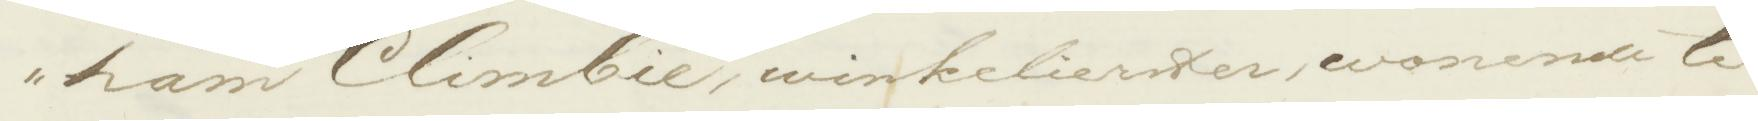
„ham Climbie, winkelierster, wonende te
